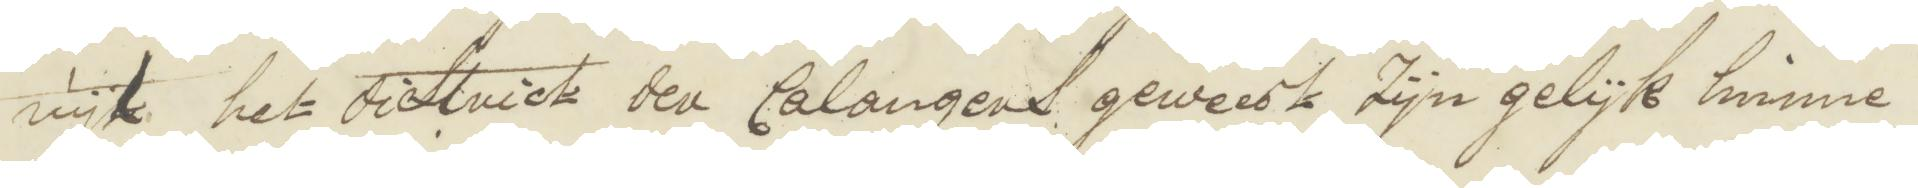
uijt het district der Calangers geweest zijn gelijk hunne
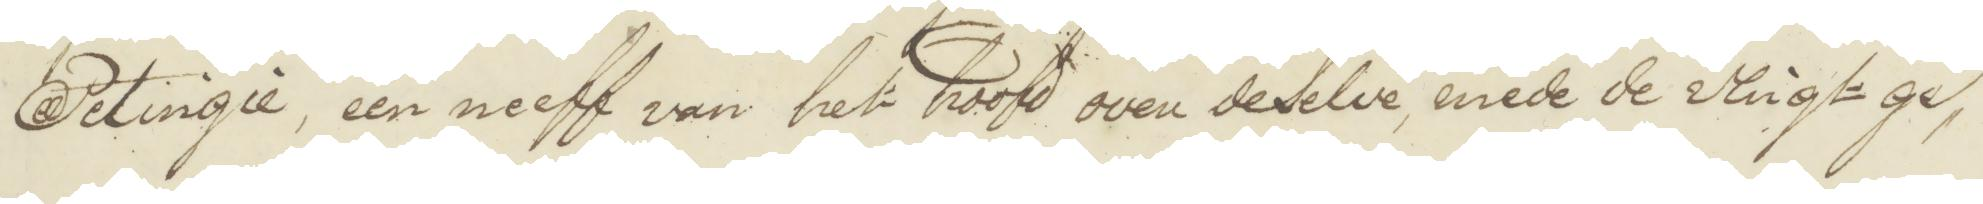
Petingie, een neeff van het hoofd over deselve, mede de vlugt ge„
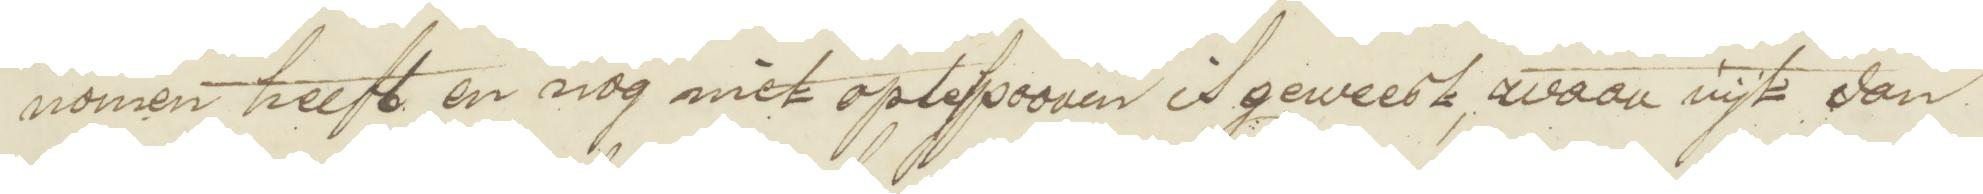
nomen heeft en nog niet optespooren is geweest, waar uijt dan
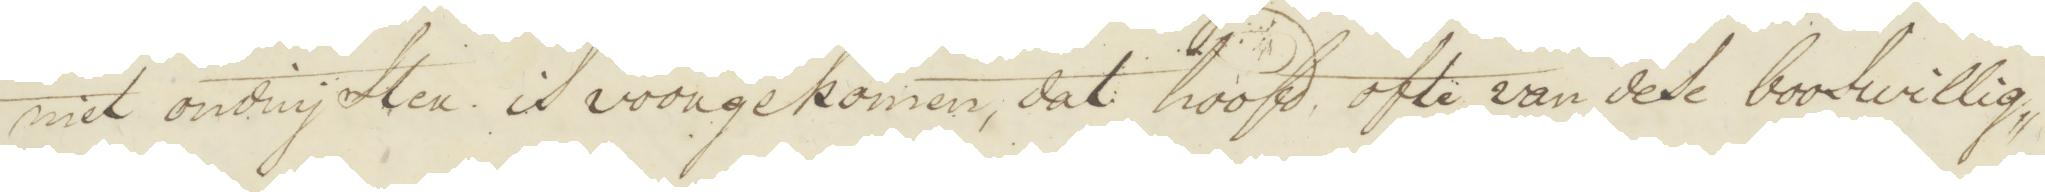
met onduijster is voorgekomen, dat hoofd ofte van dese booswillig„
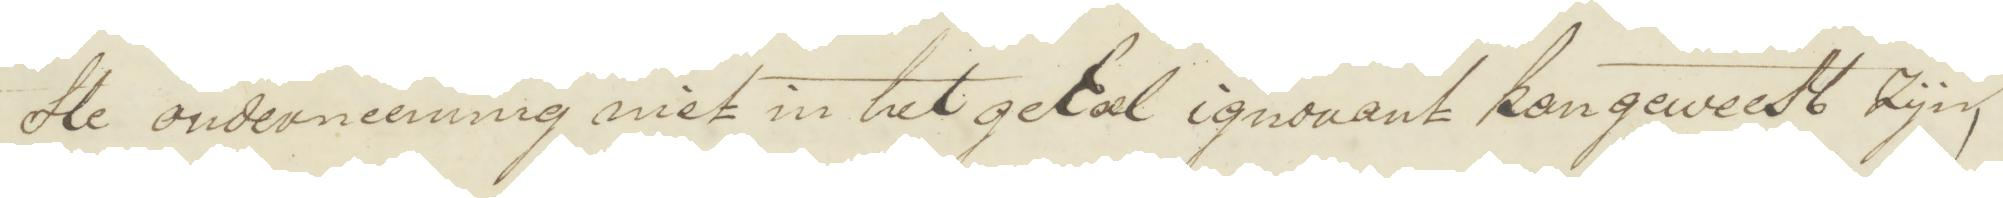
ste onderneeming niet in het geheel ignorant kan geweest zijn,
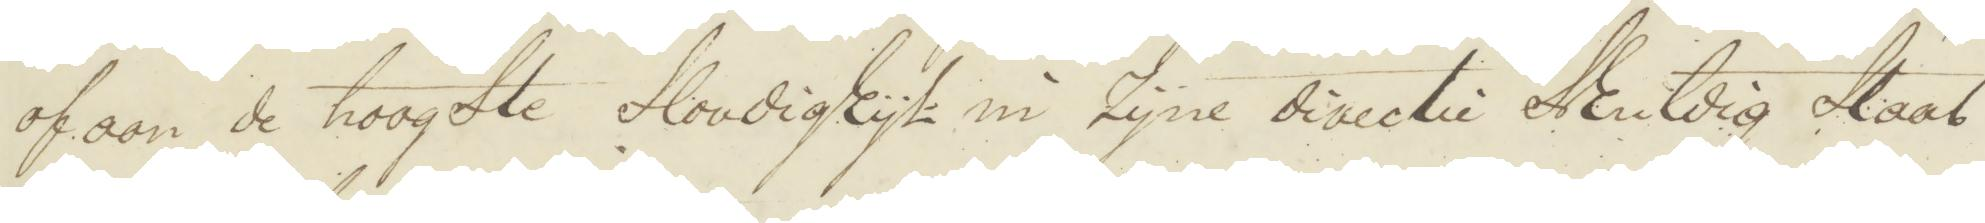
of aan de hoogste slordighijt in zijne directie schuldig staat
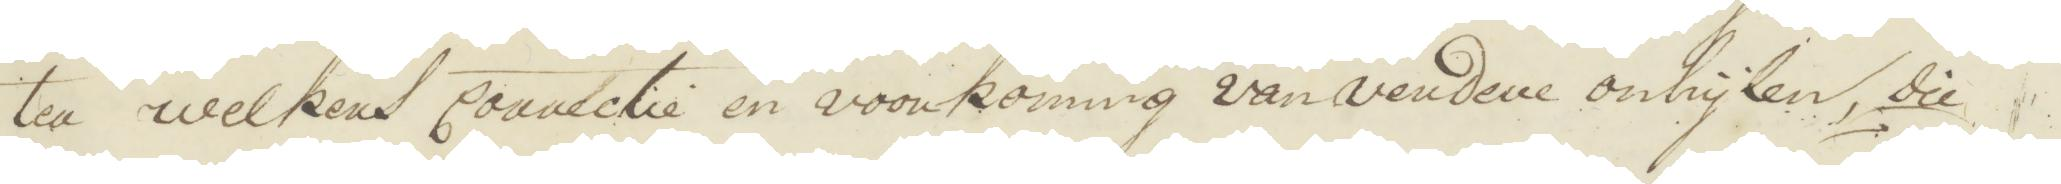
ter welkers correctie en voorkoming van verdere onhijlen, die
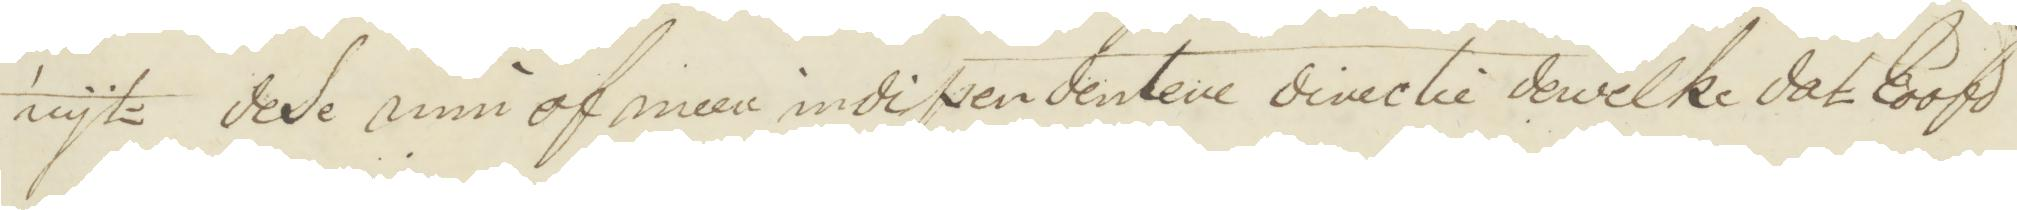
uijt dese min of meer indipendentere directie dewelke dat hoofd
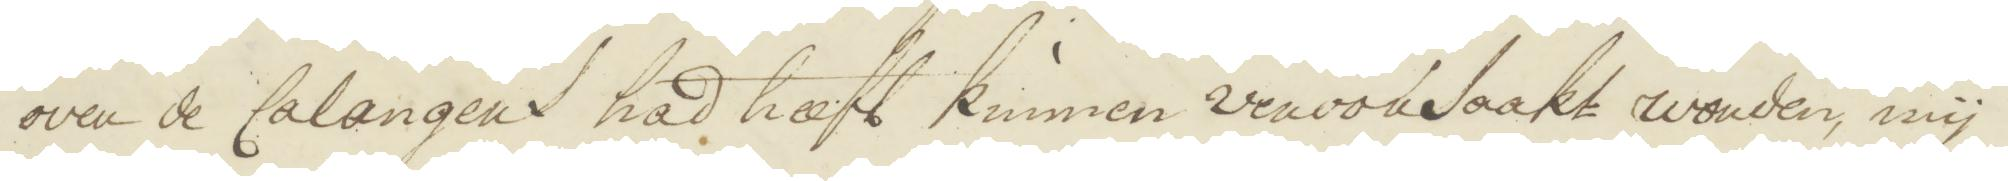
over de Calangers had heeft kunnen veroorsaakt worden, mij
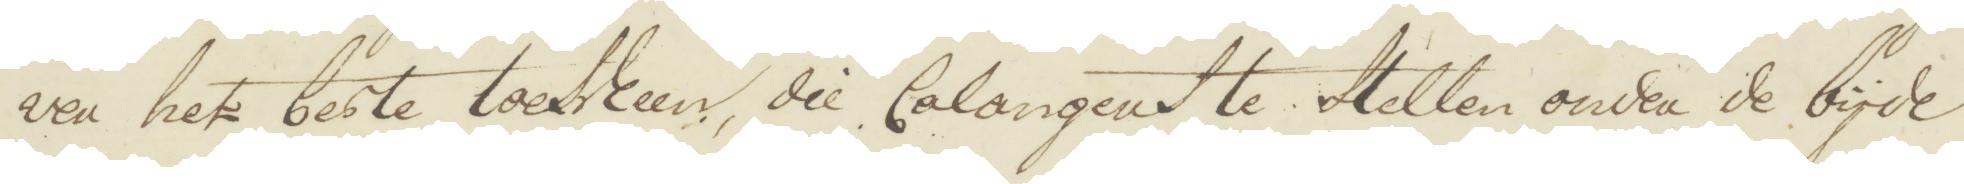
ver het beste toescheen, die Calangers te stellen onder de bijde
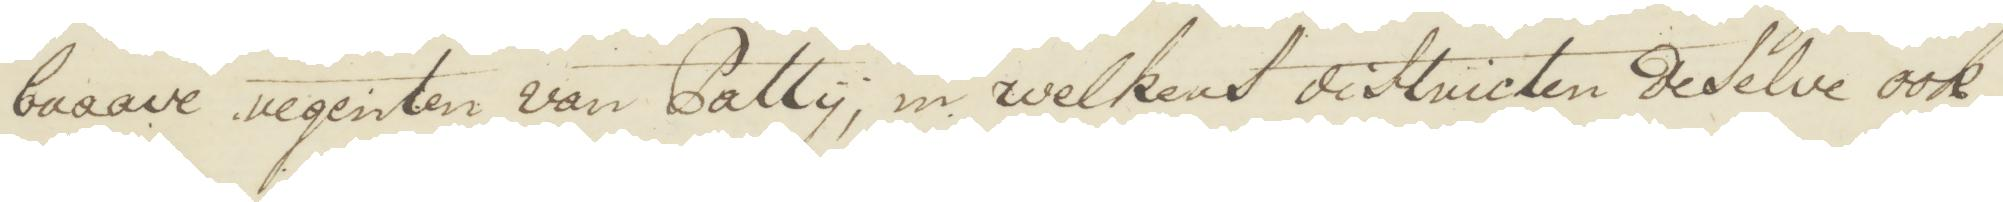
braave regenten van Pattij, in welkers districten deselve ook
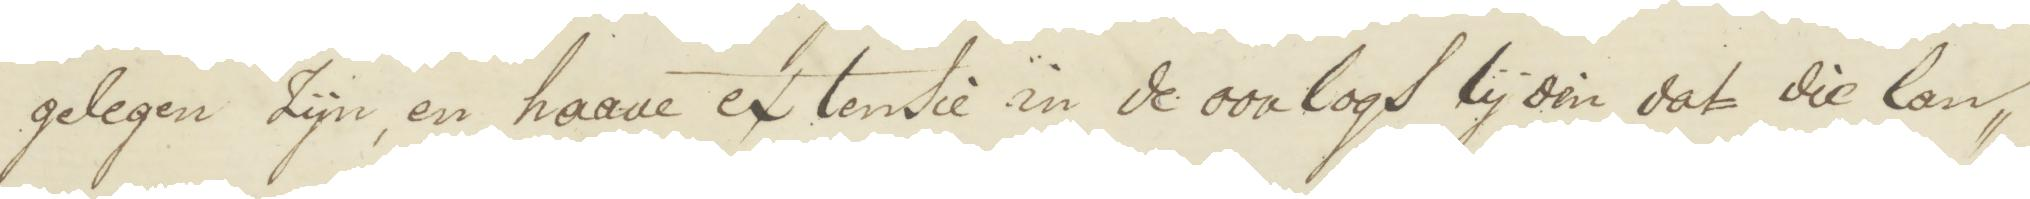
gelegen zijn, en haare extensie in de oorlogs tijden dat die lan„
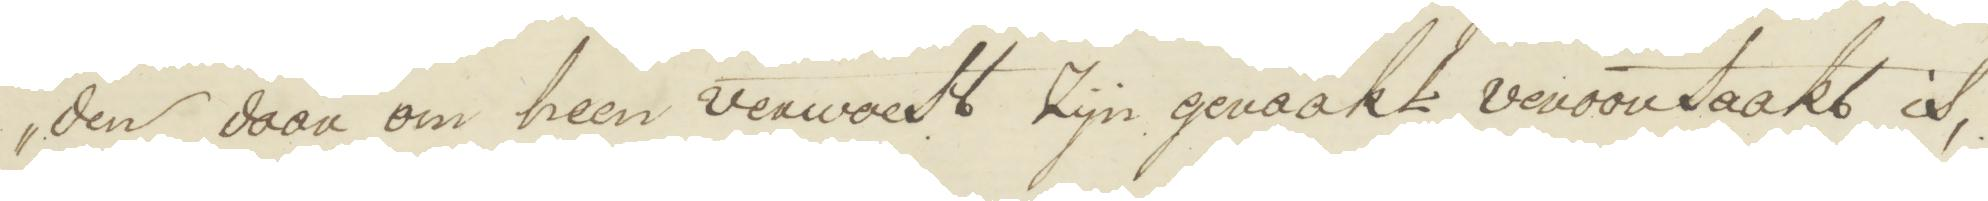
„den daar om heen verwoest zijn geraakt veroorsaakt is;
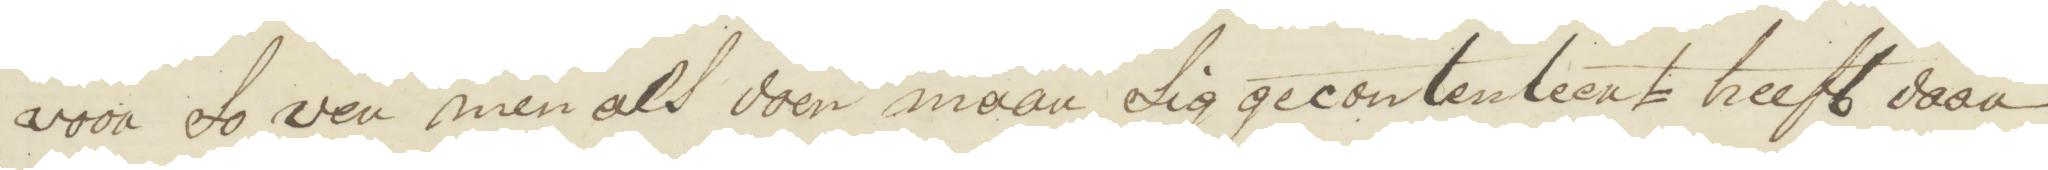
voor so ver men als doen maar sig gecontenteert heeft daar
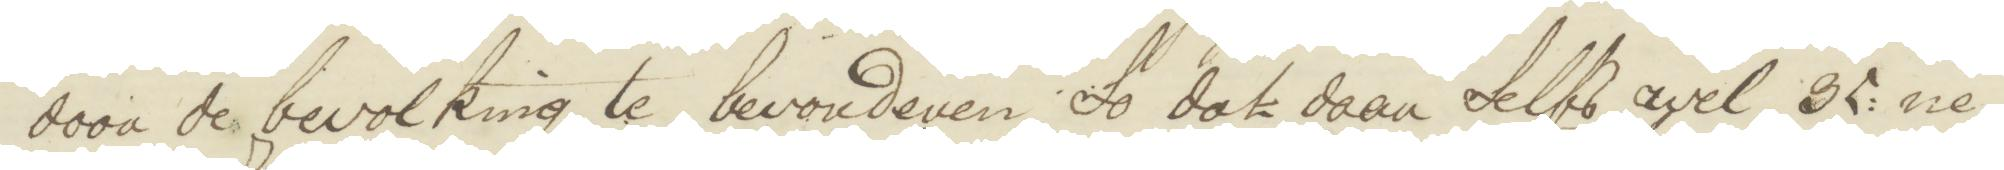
door de bevolking te bevonderen, so dat daar selfs wel 35: ne
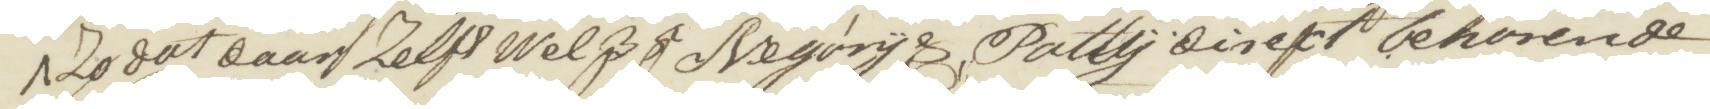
^zodat daar zelfs wel 38 Negorijen, Pattij direkt behorende
